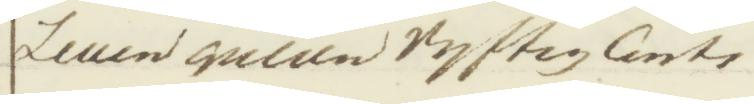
Zeven gulden Vyftig Cents
